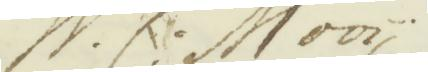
W: C: Mooij
